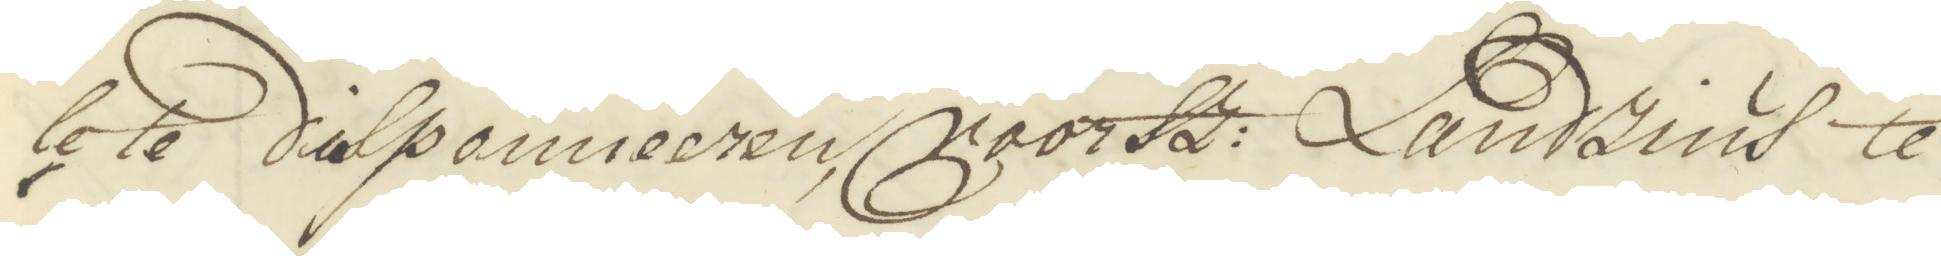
„le te disponneeren, voorsz: Landzius te
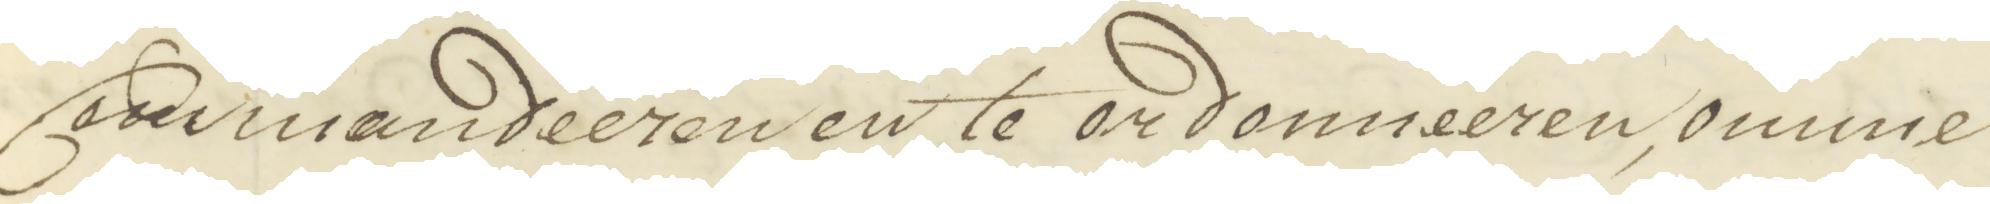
Commandeeren, en te ordonneeren, omme
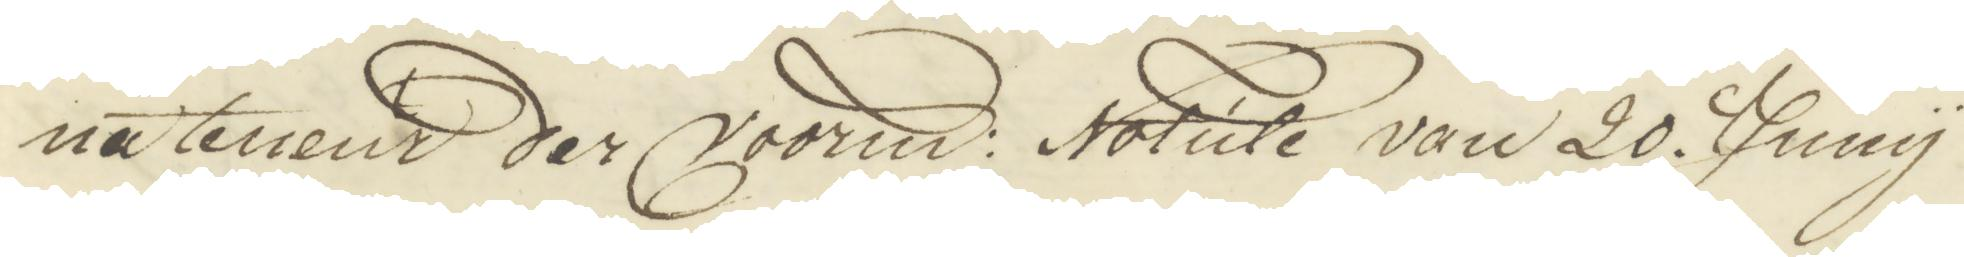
na teneur der voorm: Notule van 20. Junij
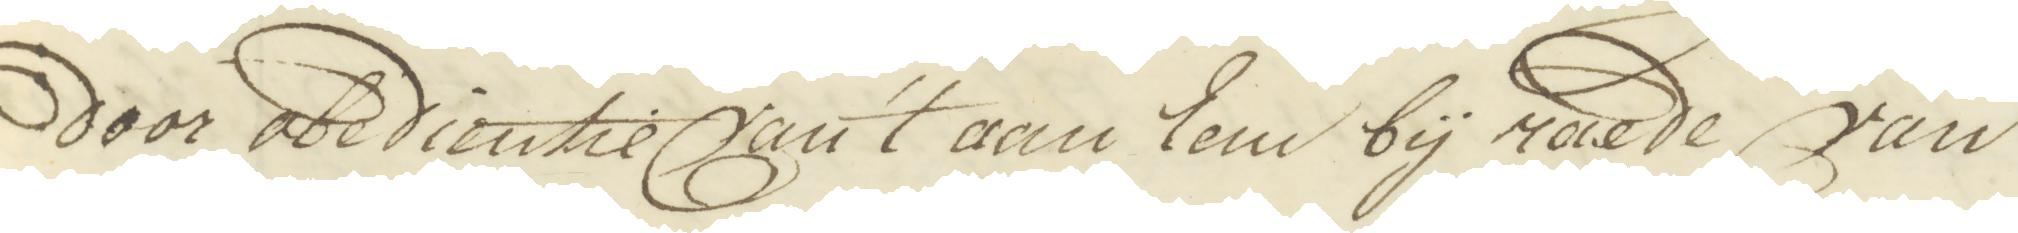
door obedientie van ’t aan hem bij raede van
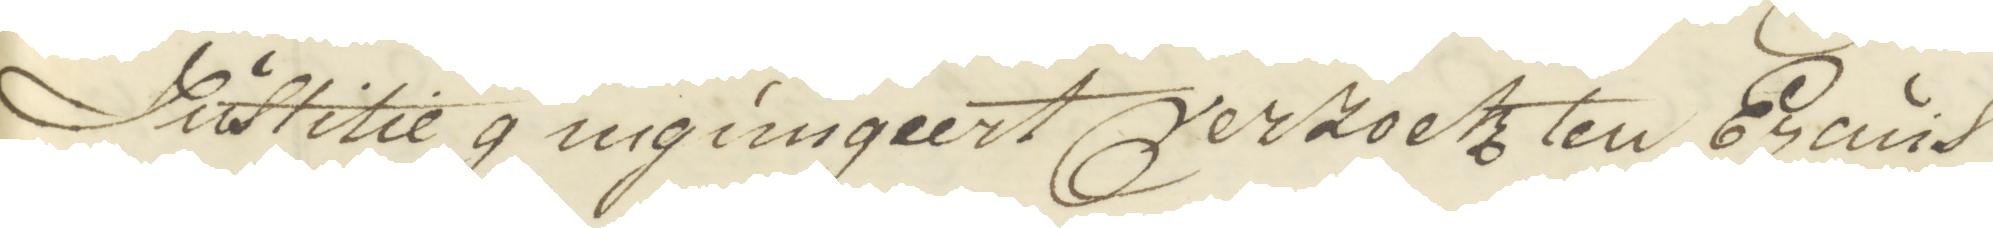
Justitie g’ingungeert verzoek ten Excuus
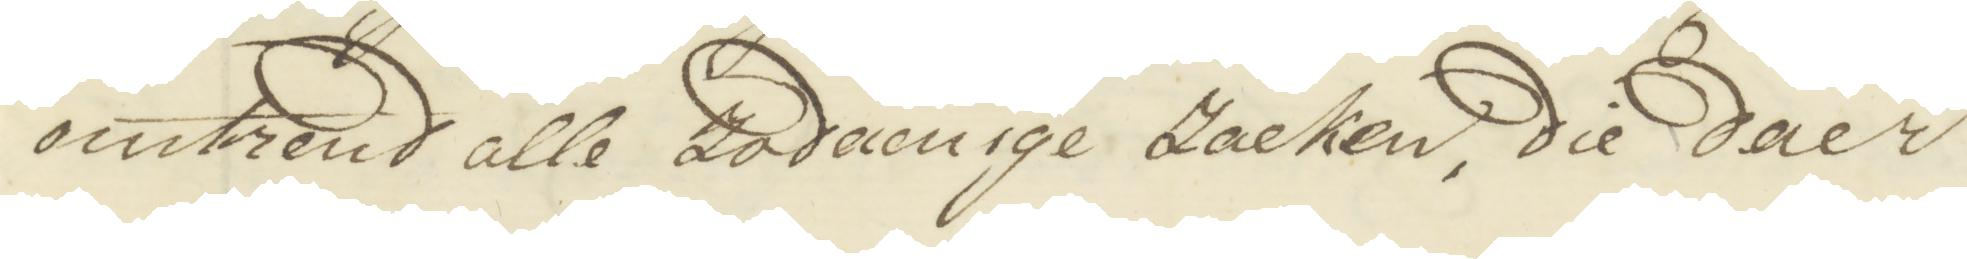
omtrend alle zodaenige zaeken, die daer
